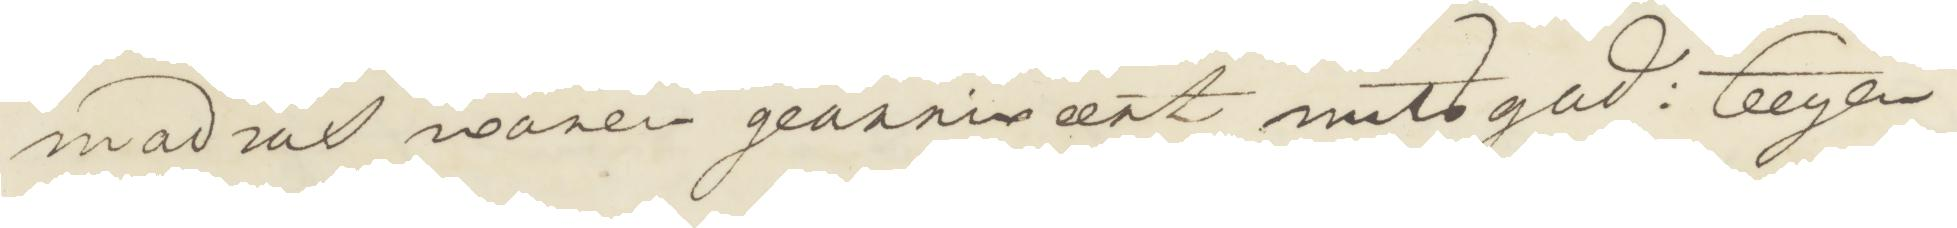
madras waren gearriveert mitsgad:s teegen
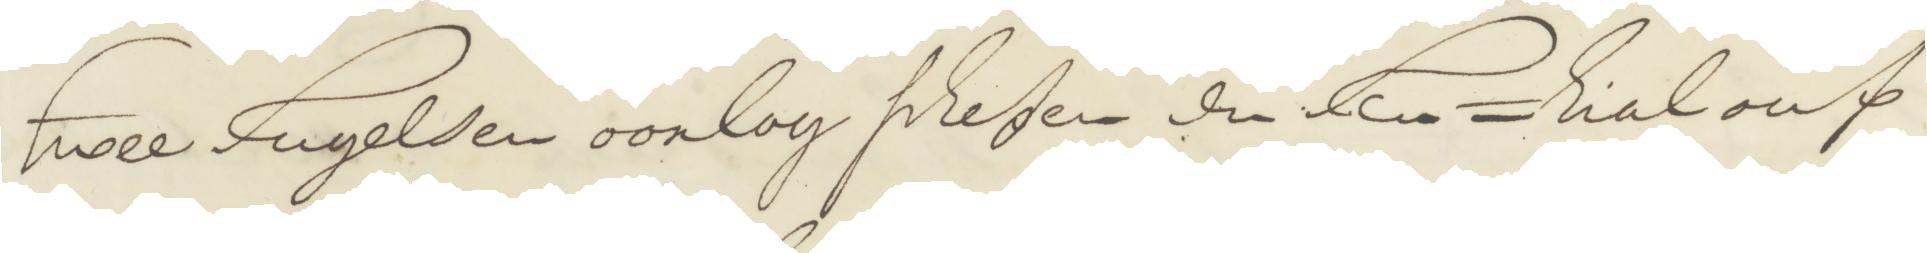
twee Engelsen oorlog schepen en Een chialoup
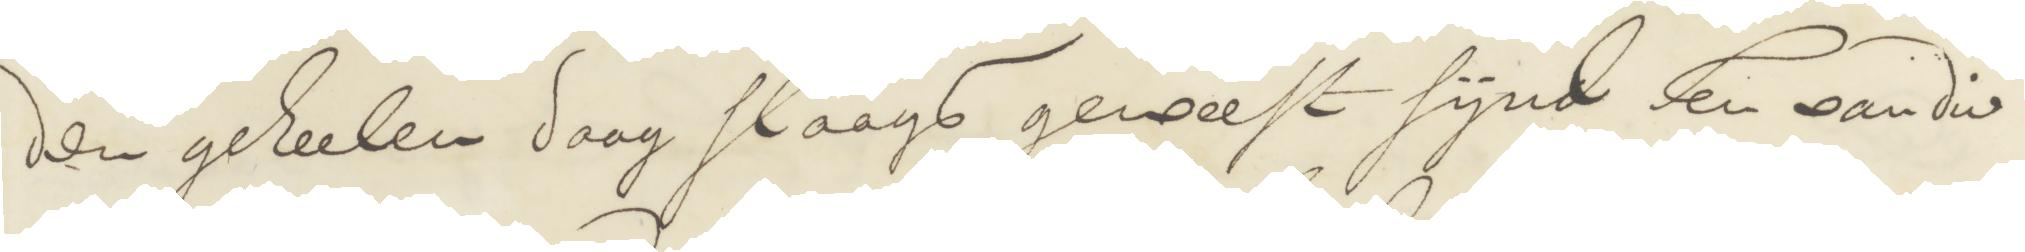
den geheelen daag slaags geweest sijnde Een van die
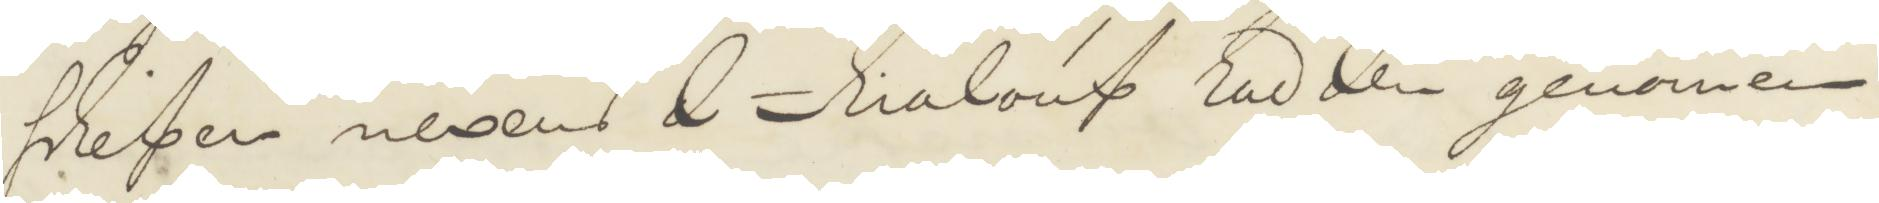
schepen nevens d chialoup hadden genomen
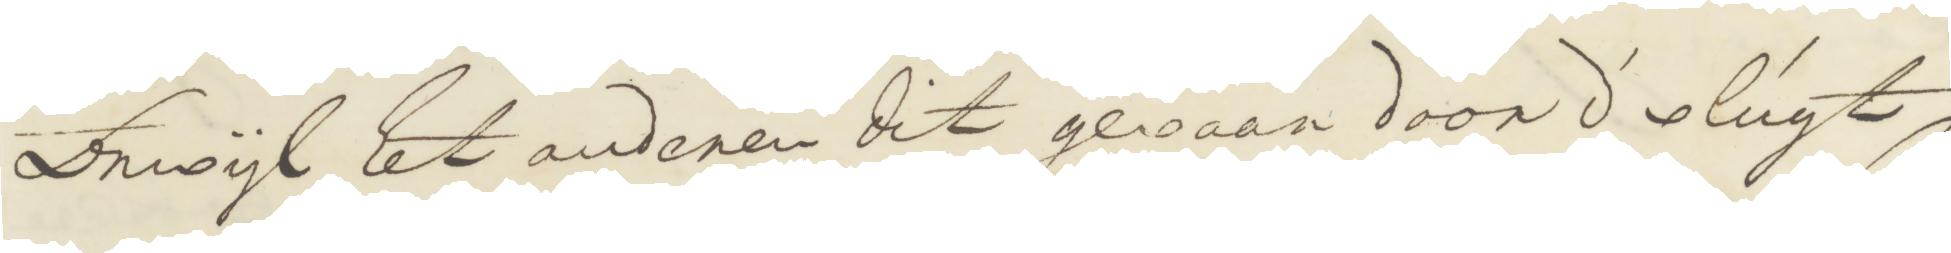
terwijl het anderen dit gevaar door d'vlugt
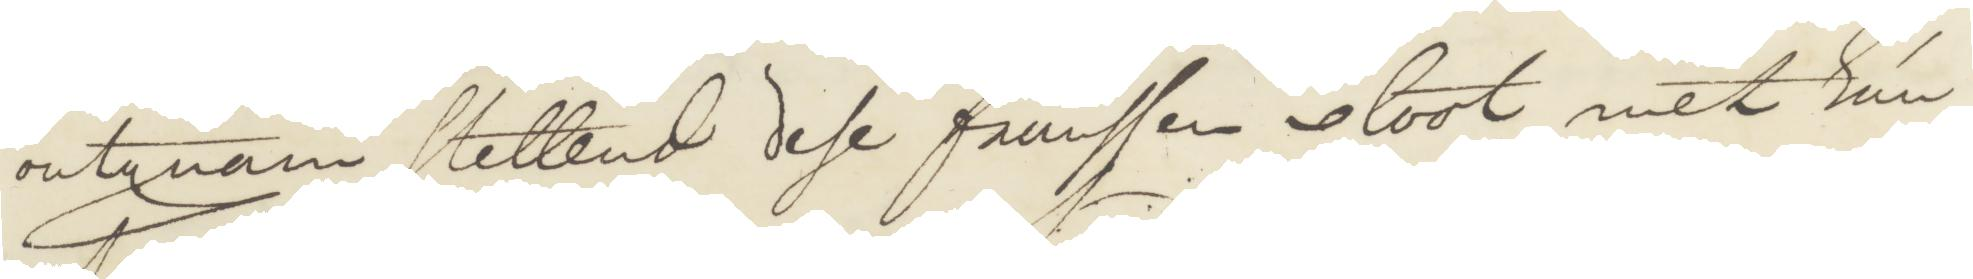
ontquam stellend dese fransssen vloot met hun
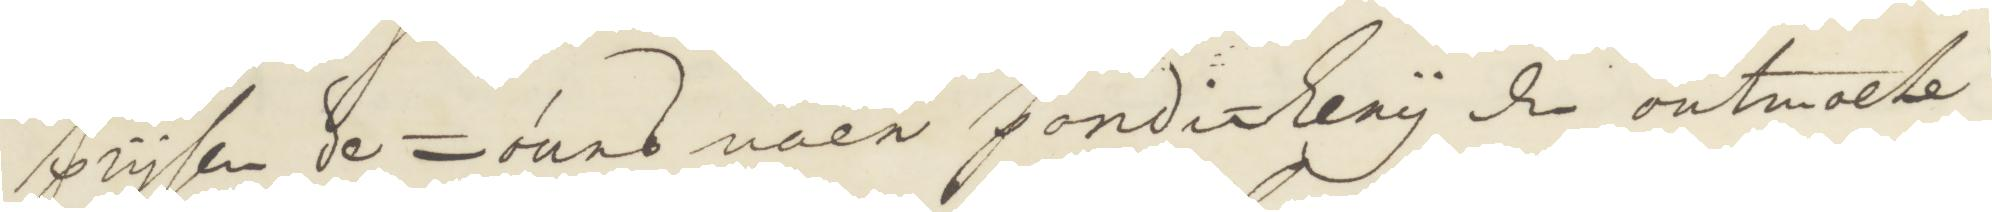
prijsen de cours naer pondicherij en ontmoete
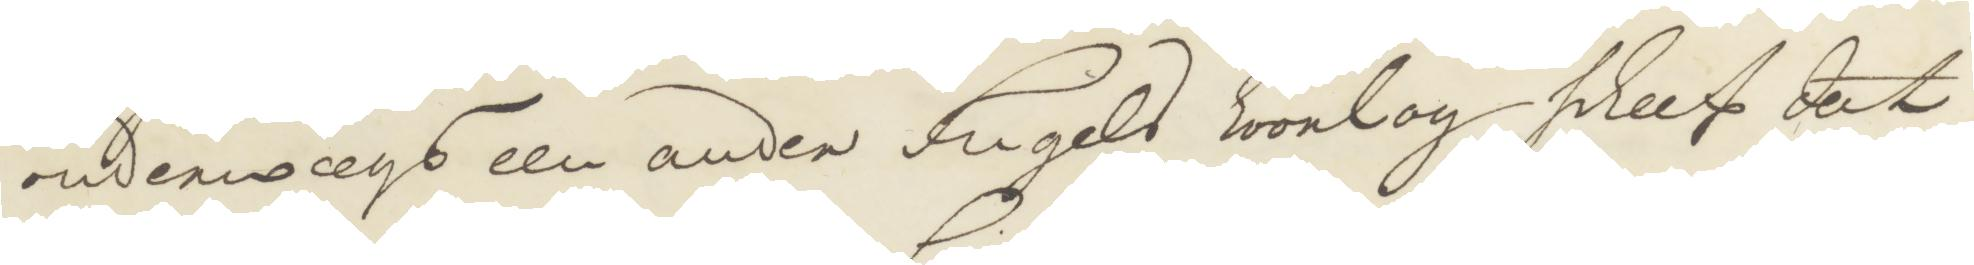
onderweegs een ander Engels hoorlog scheep dat
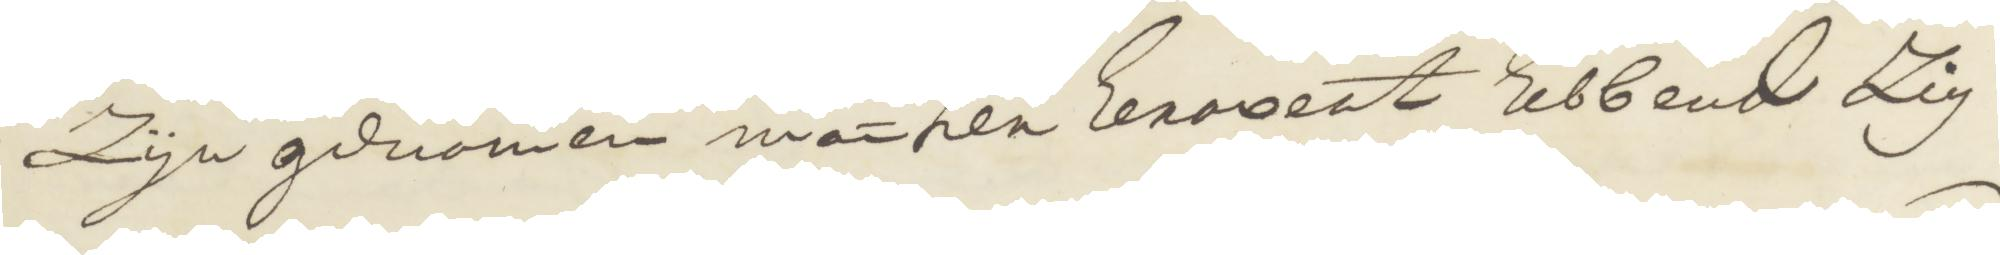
Zijn genomen macker herovert hebbend Zig
